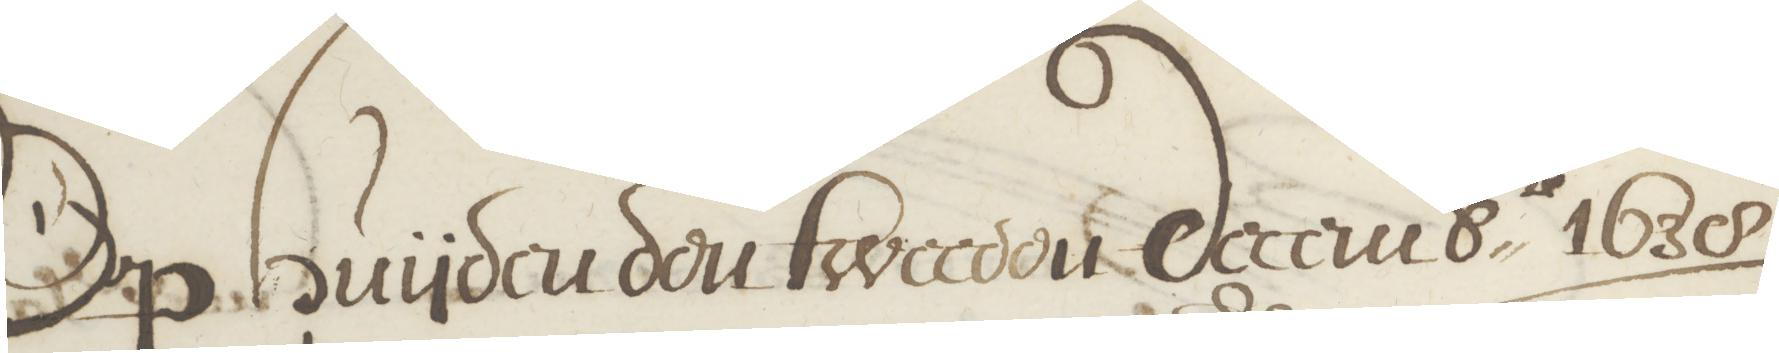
Op huijden den tweeden decemb„r 1638
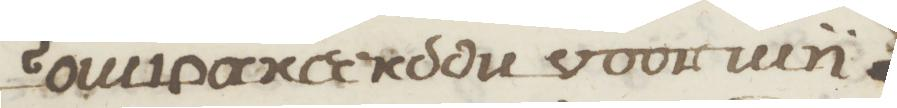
Compareerden voor mij Gerrit
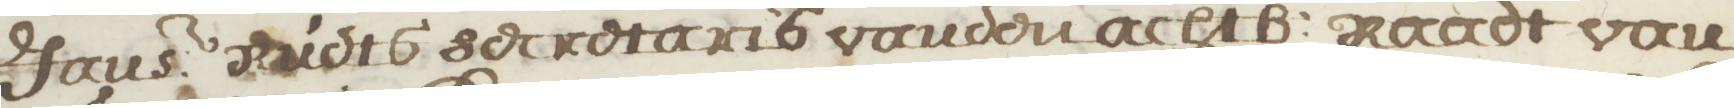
Jans:n rudts secretaris van den achtb: raadt van
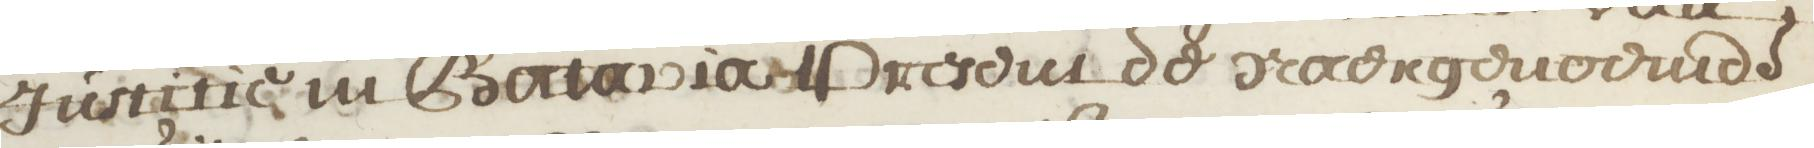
Iustitie in Batavia present de naergenoemde
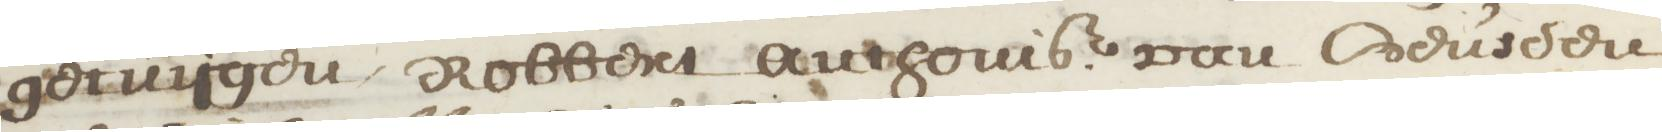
getuijgen, robbert anthonis.n van heusden
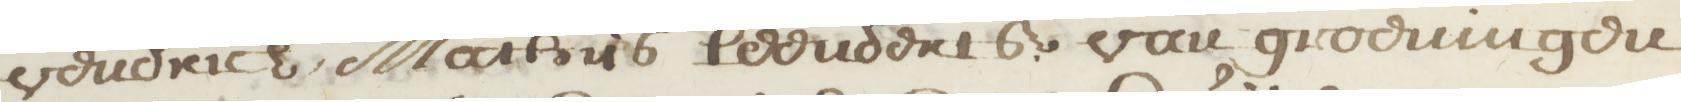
vendrich, Mathijs leendert.n van groeningen
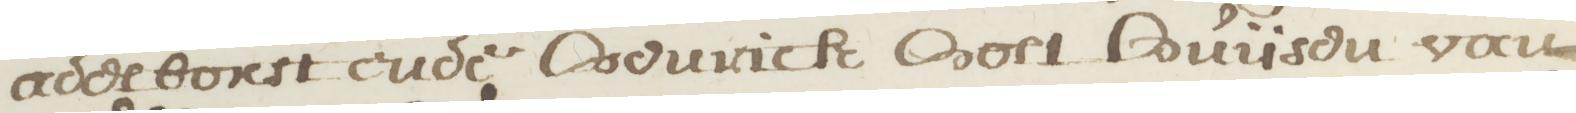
adelborst ende henrick holthuijsen van
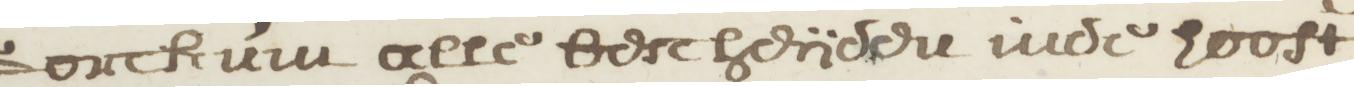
Gorckum alle bescheijden inde hooft
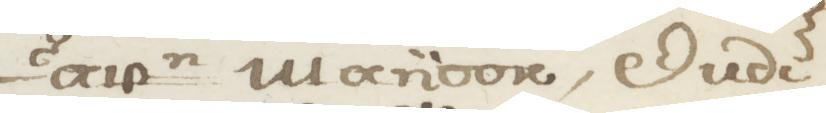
wacht onder d: E: Cap=n maijoor, Ende
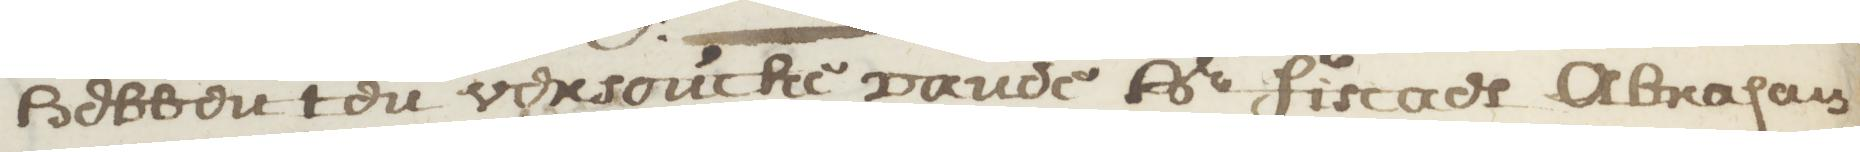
hebben ten versoucke vande hr fisael abraham
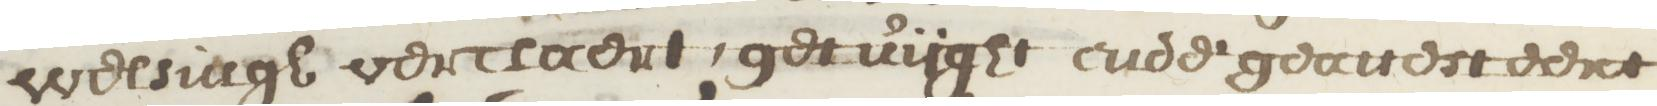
welsingh verclaert, getuijght ende geattesteert
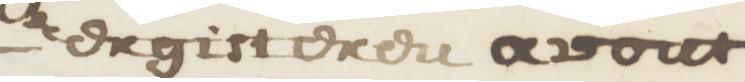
hoe waer is, dat nu Eergisteren avont
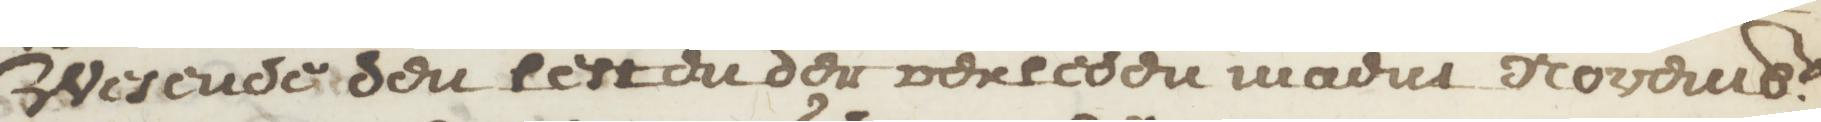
wesende den lesten der verleden maent novemb.s
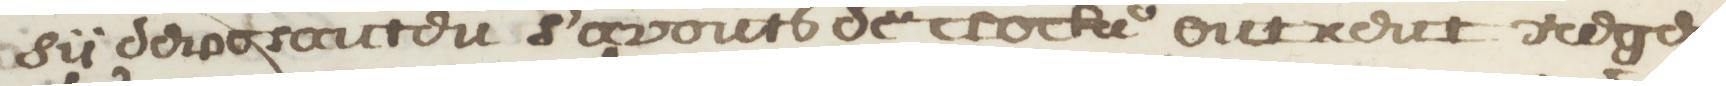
sij deposanten s'avonts de clocke ontrent negen
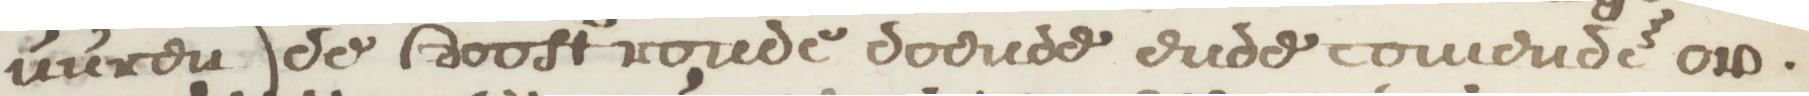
uuren de hooft ronde doende ende comende op
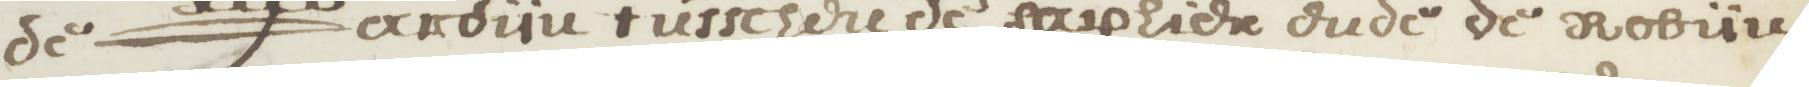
de Gardijn tusschen de saphier ende de robijn
